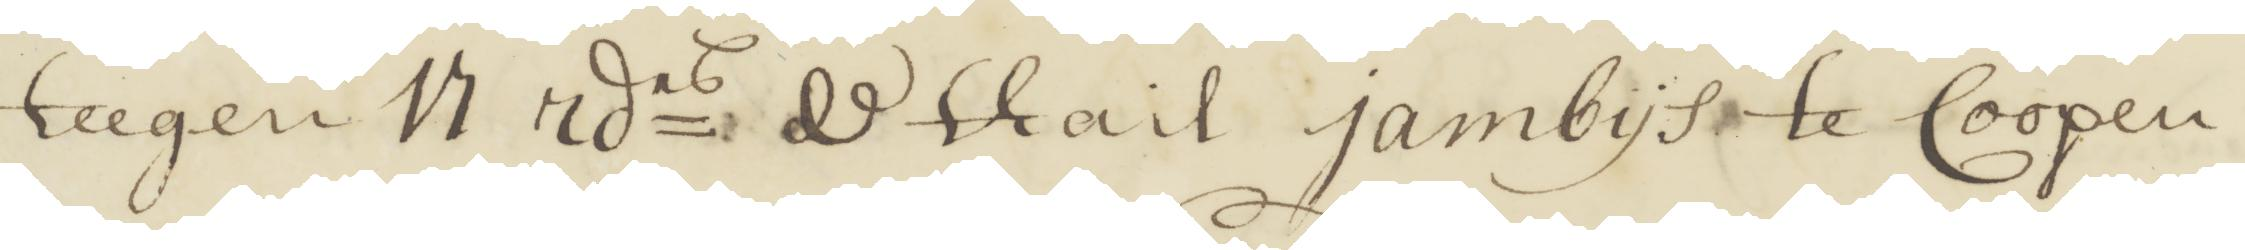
teegen 17 rd=rs de thail jambijs te coopen
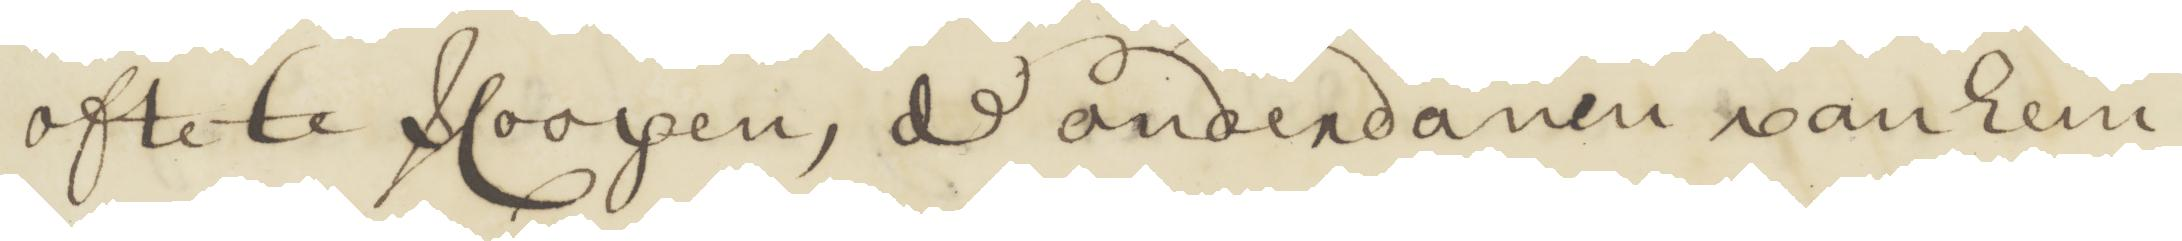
ofte te vercoopen, de onderdanen van hem
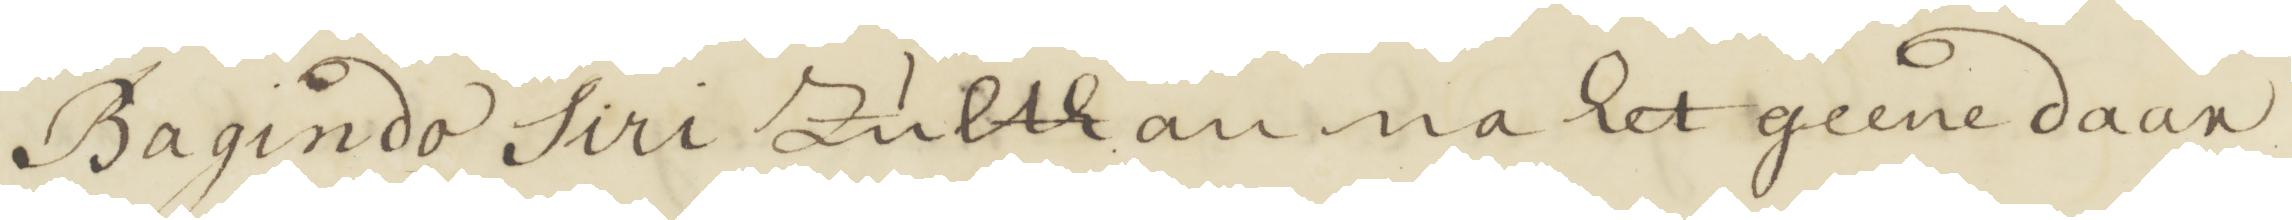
Bagindo Siri zulthan na het geene daar
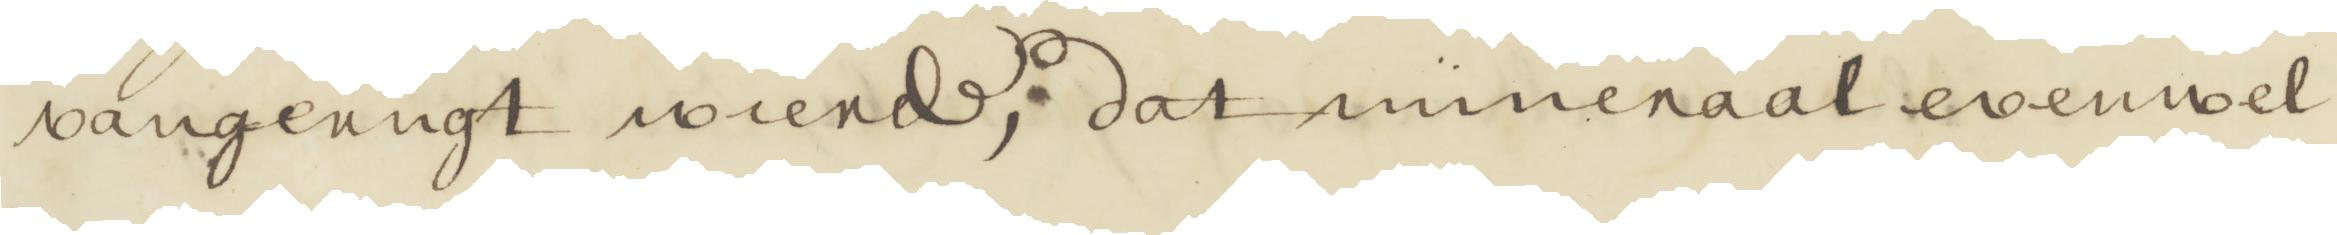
van gerugt wierde, dat mineraal evenwel
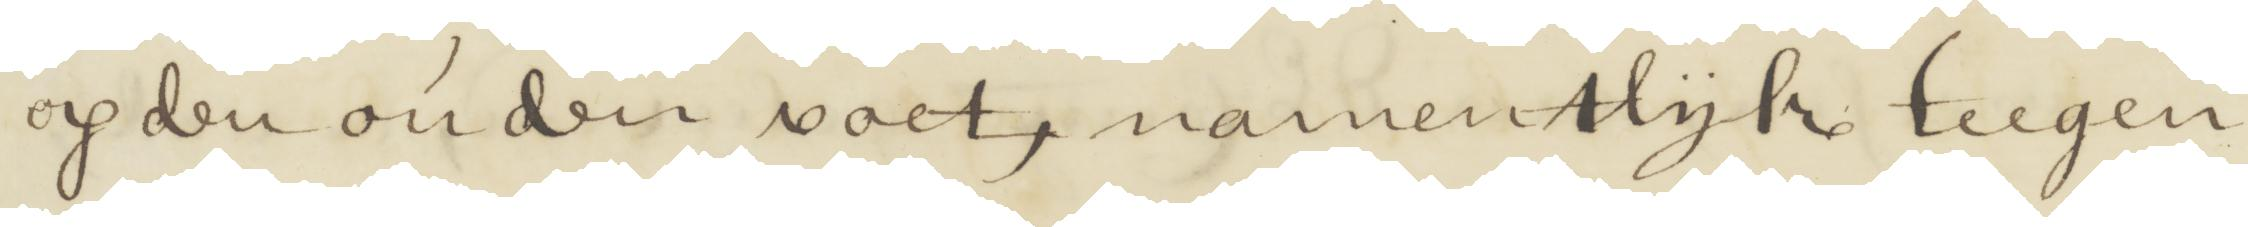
op den ouden voet, namentlijk teegen
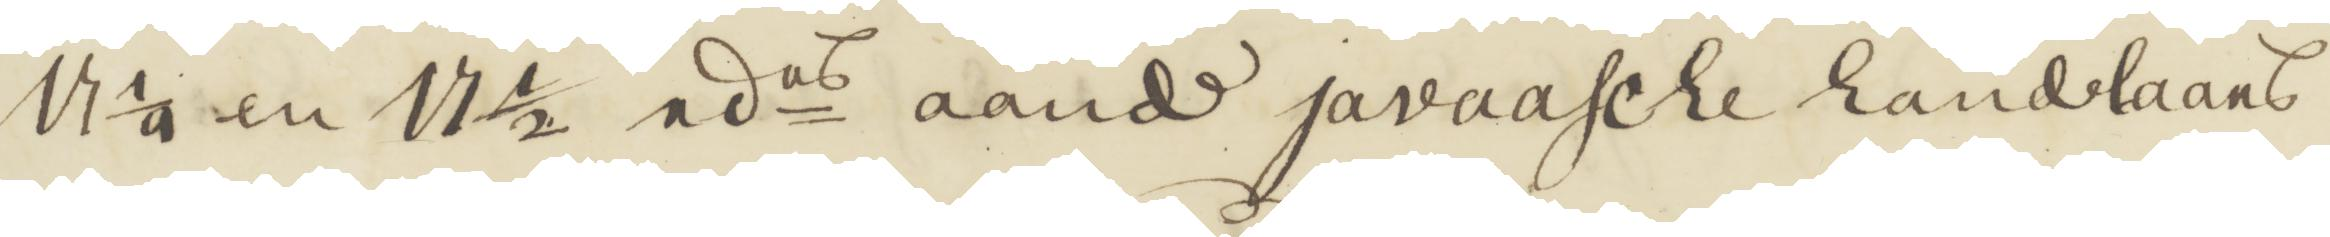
17¼ en 17½ rd=rs aande javaasche handelaars
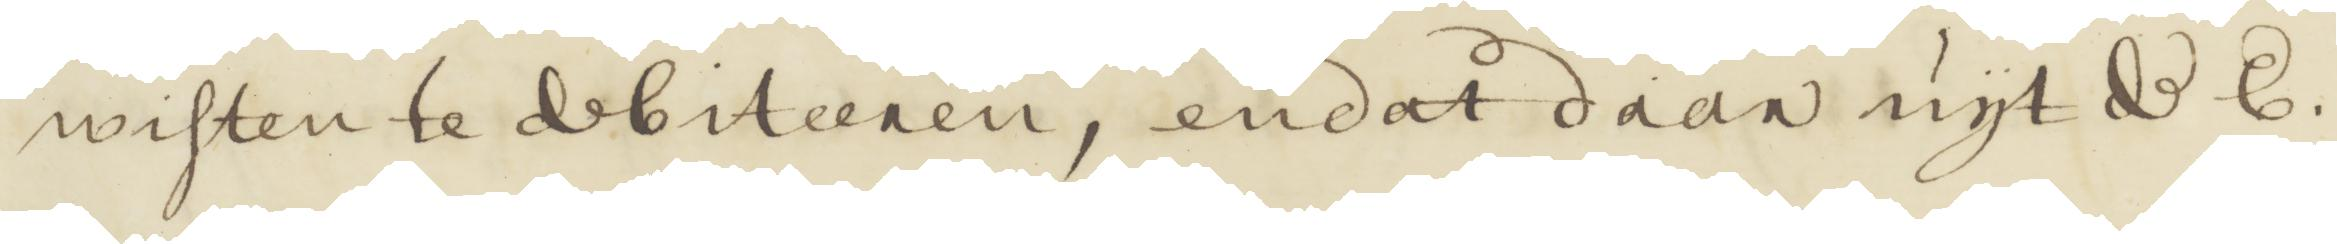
wisten te debiteeren, en dat daar uijt de E.
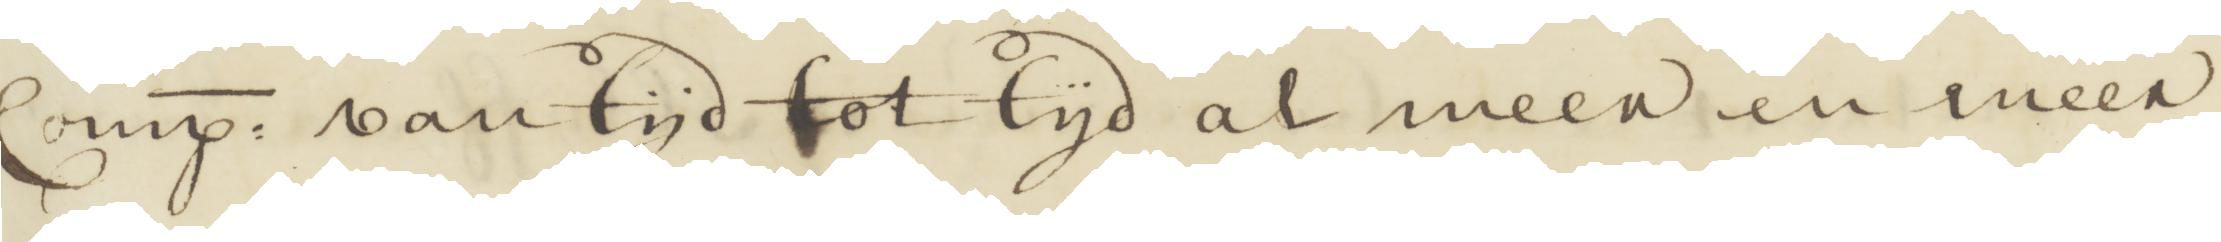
Comp: van tijd tot tijd al meer en meer
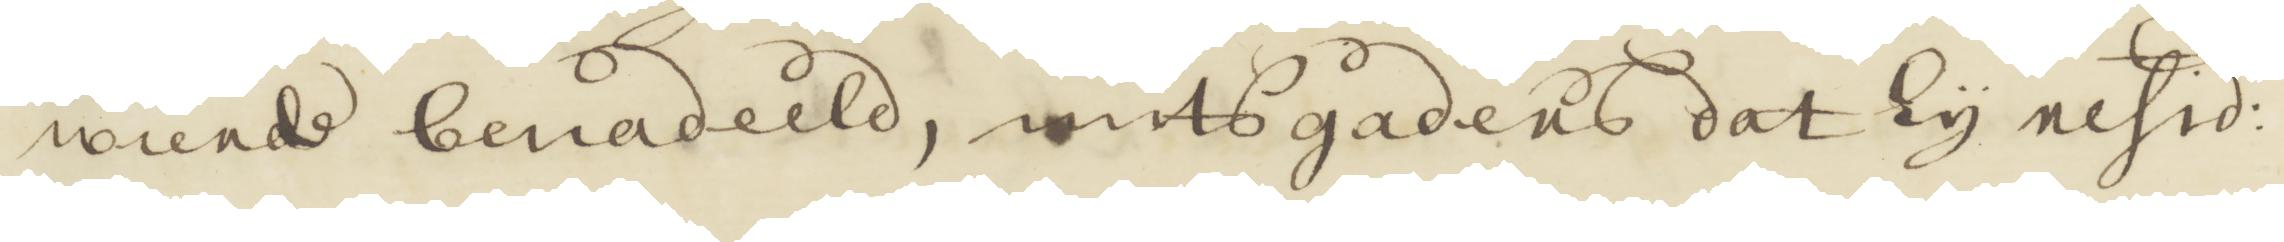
wierde benadeeld, mitsgaders dat hij resid:
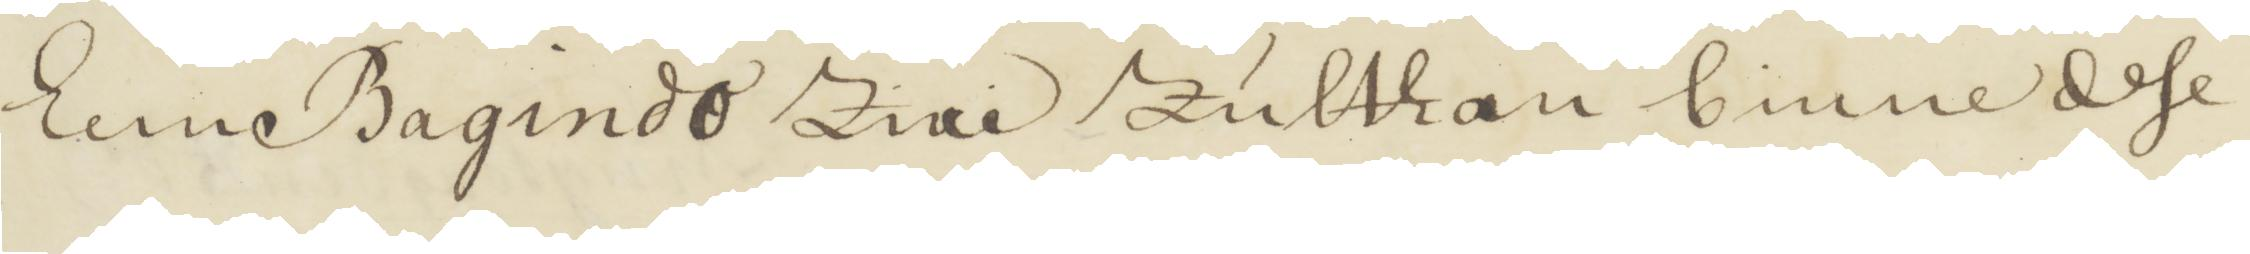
hem Bagindo ziri zulthan binne dese
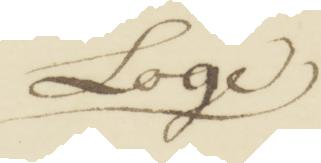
Loge
